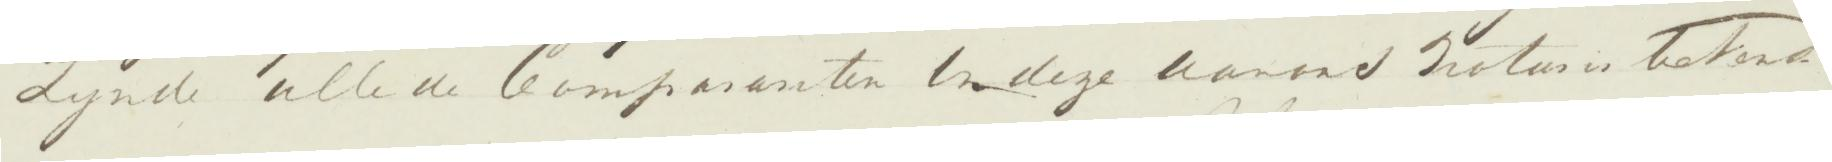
zynde alle de Comparanten in deze aan ons Notaris is bekend
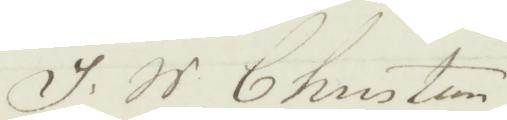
J. W Christen
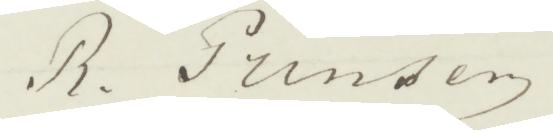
R. Prinsen
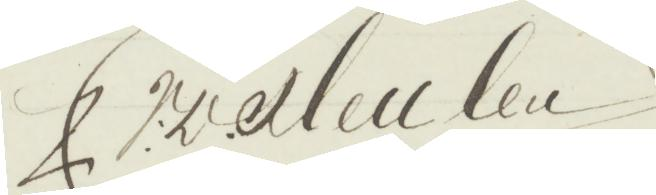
Z V:D. Meulen
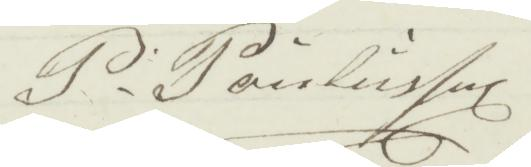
P: Paulussen
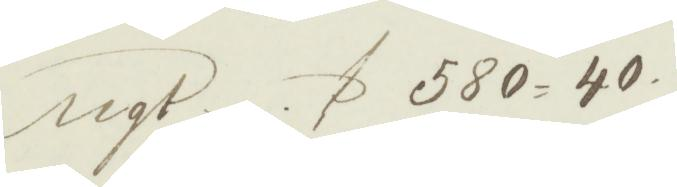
regt ƒ 580=40.
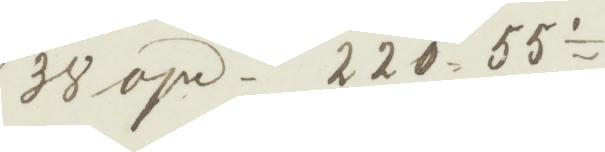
38 opc - 220=55½
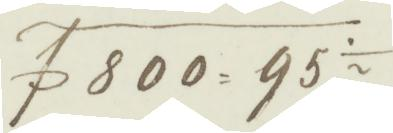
ƒ 800=95½
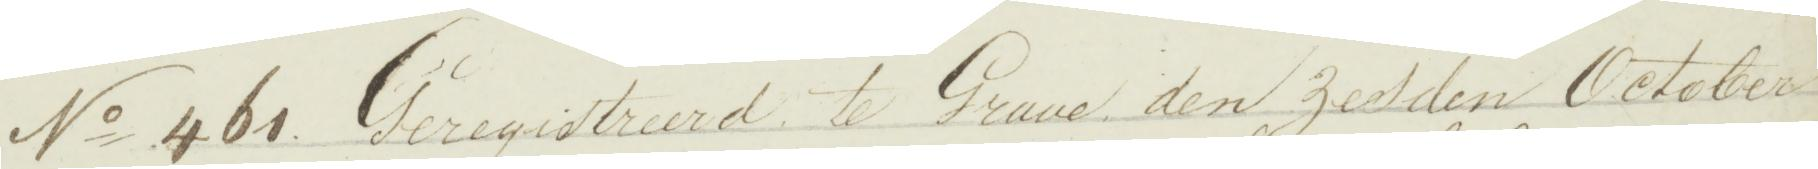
N=o 461. Geregistreerd te Grave den Zesden October
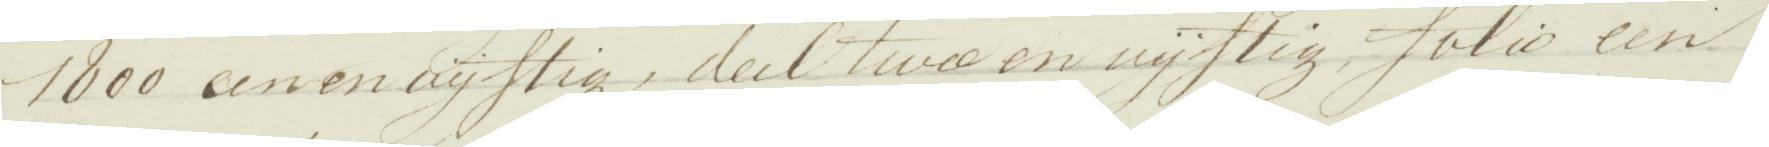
1800 een en vijftig, deel twee en vijftig, folio een
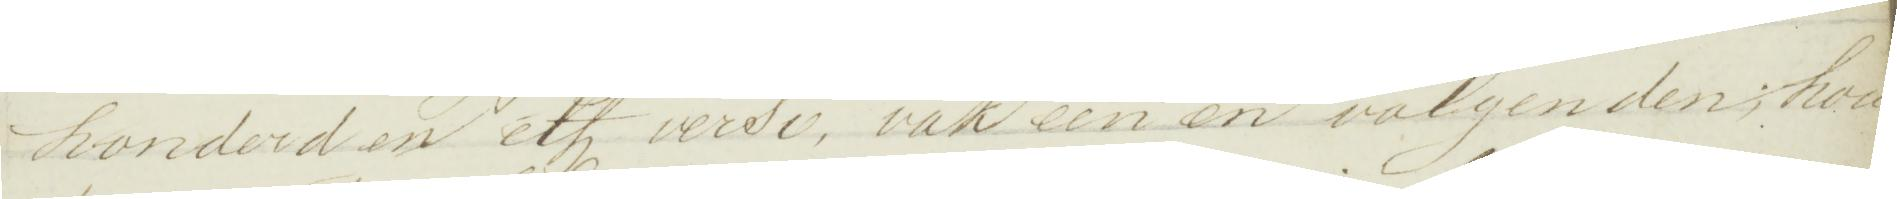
honderd en elf verso, vak een en volgenden; hou
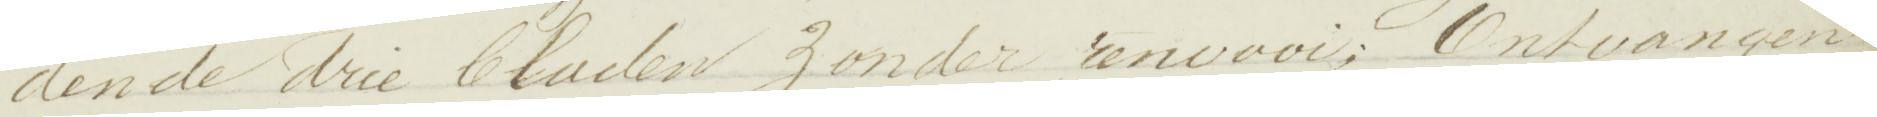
dende drie bladen zonder renvooi; Ontvangen
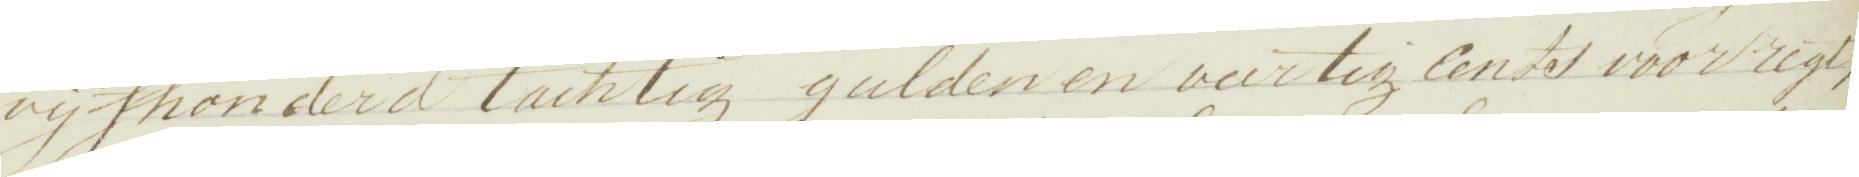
vijfhonderd tachtig gulden en veertig Cents voor regt,
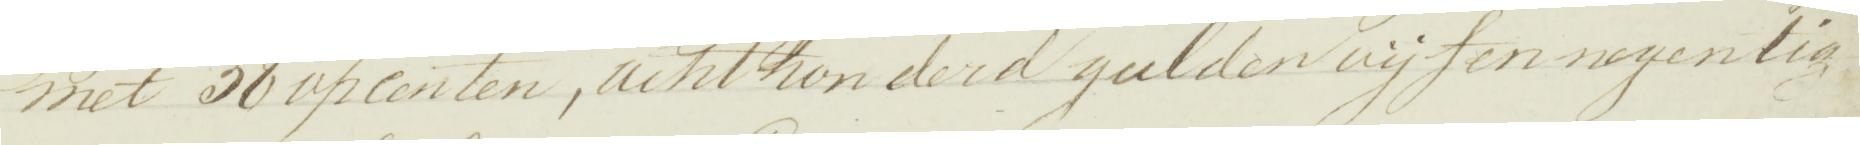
met 38 opcenten, acht honderd gulden vijf en negentig
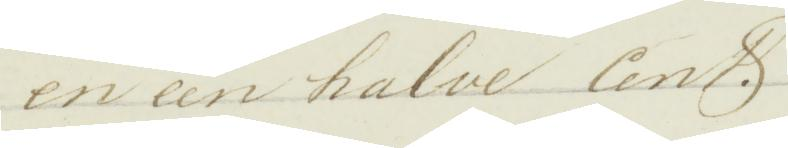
en een halve Cent.
